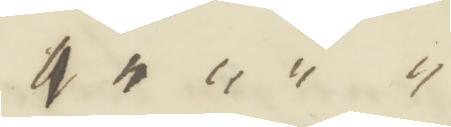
4 „ „ „ „
